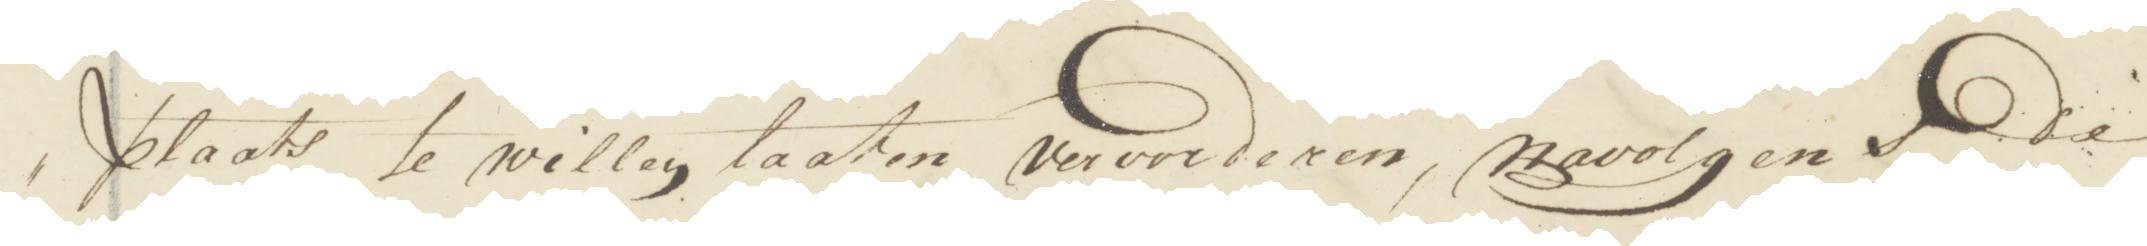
„plaats te willen laaten vervorderen, navolgens die
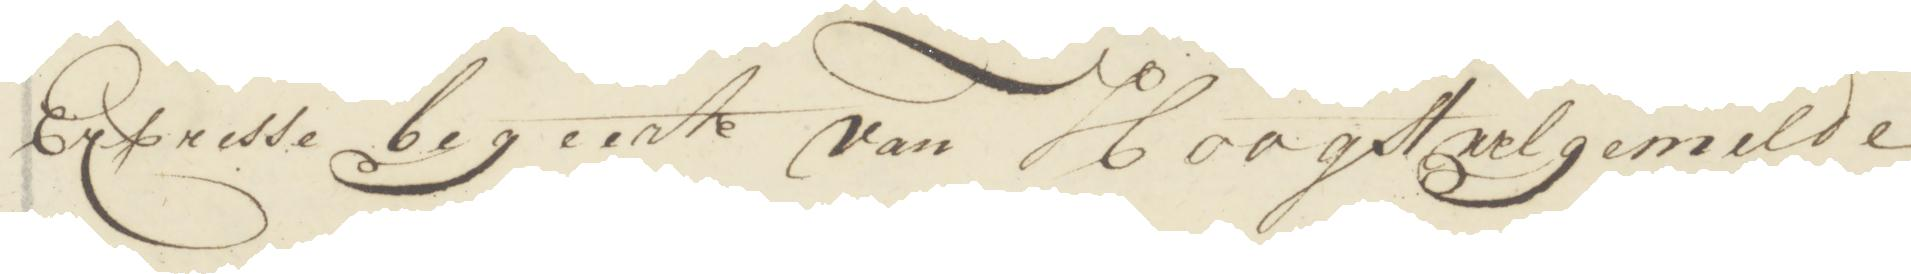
Expresse begeerte van Hoogst welgemelde
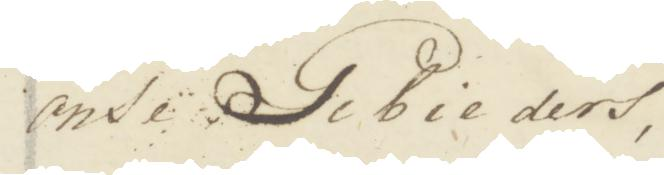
onse Gebieders,
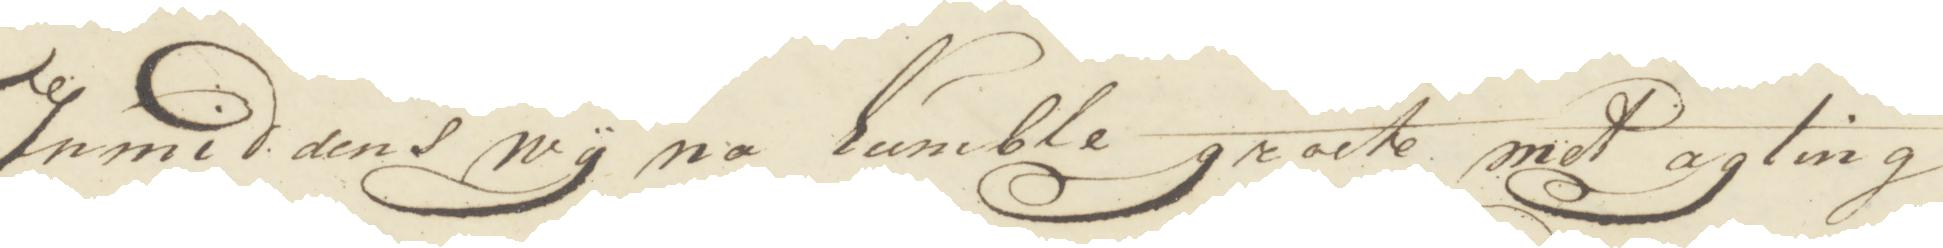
Jnmiddens wij na humble groete met agting
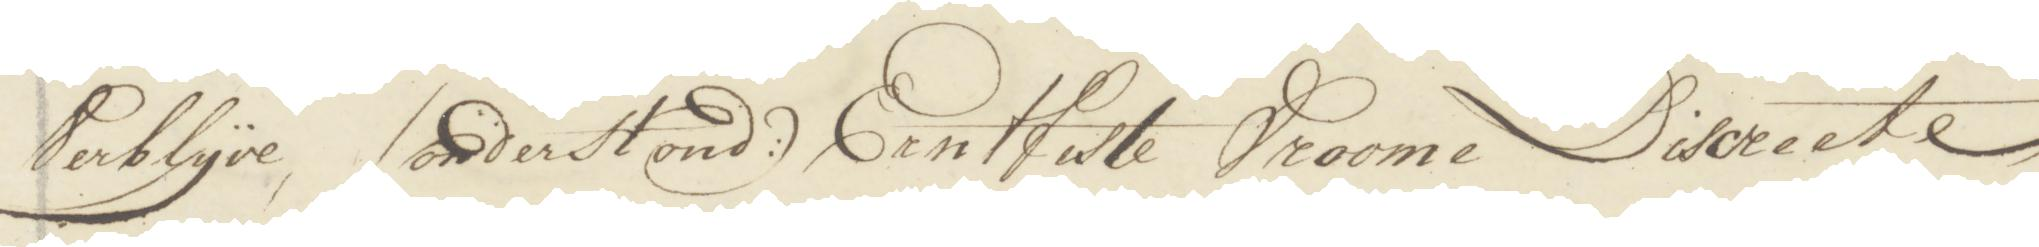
verblijve, /onderstond:) Erntfeste Vroome Discreete
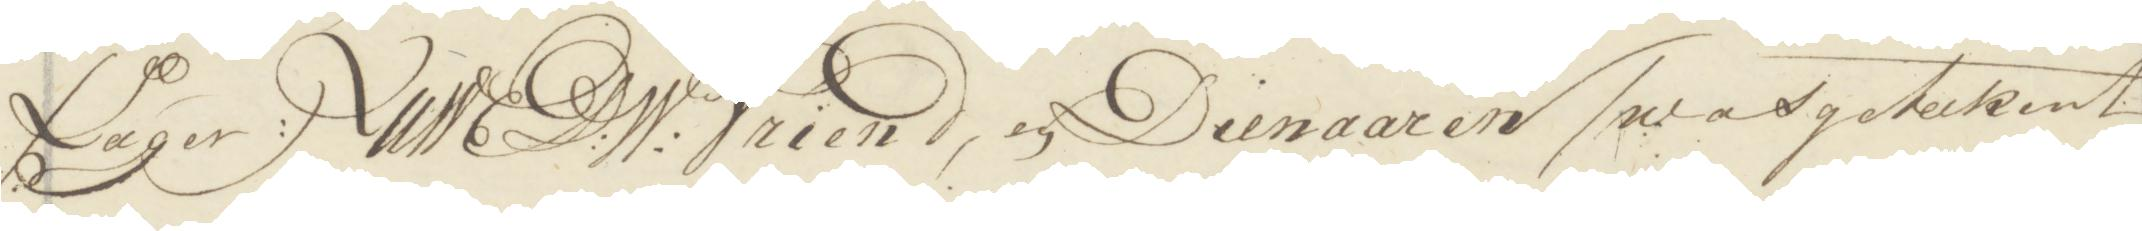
Lager:) Uw Ed„e vriend, en Dienaaren/ was geteekent
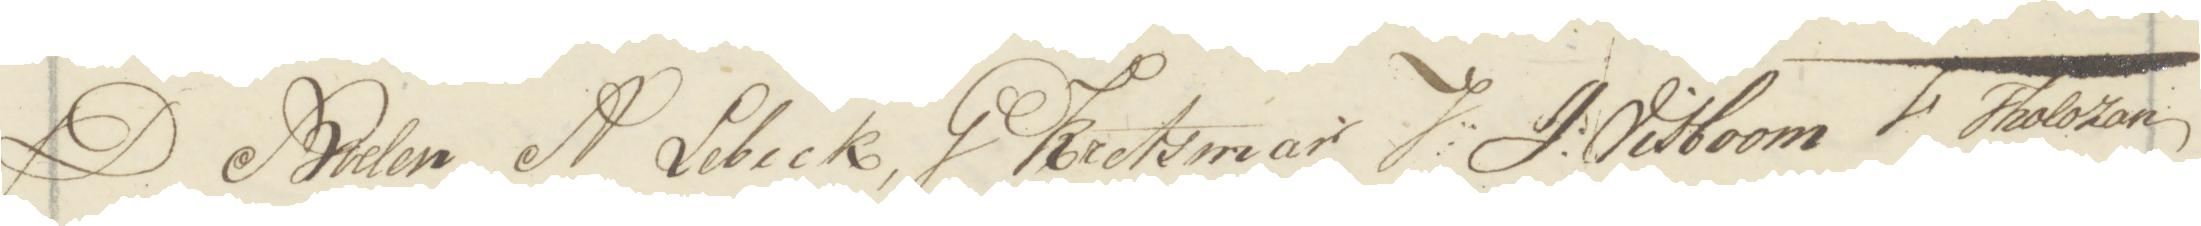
D Bielen A Lebeck, G Kretsmar J:J D: Visboom F Tholozon,
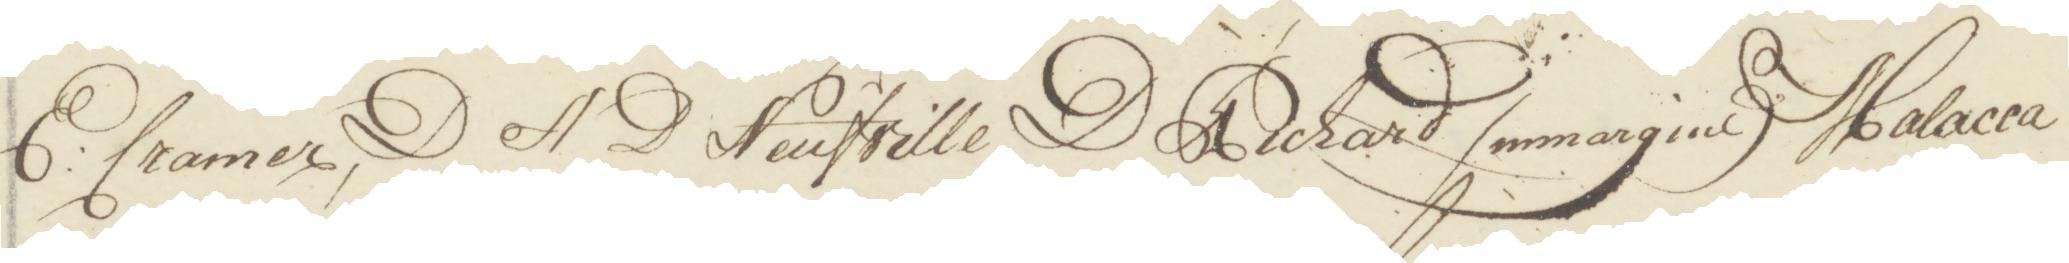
E: Cramer, D A D Neufville, D Richard / inmargine Malacca
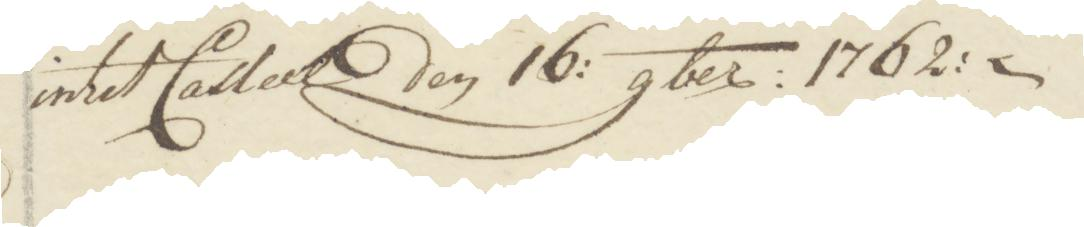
in het Casteel den 16: 9ber: 1762:—
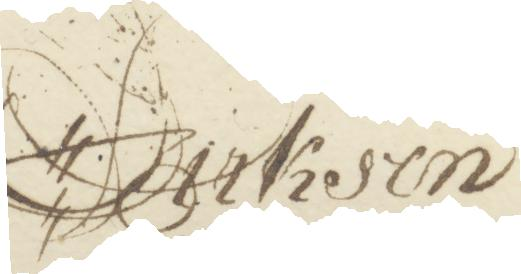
Wirkern
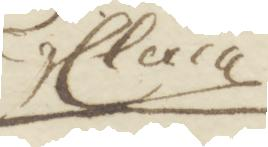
„ Cleccq
